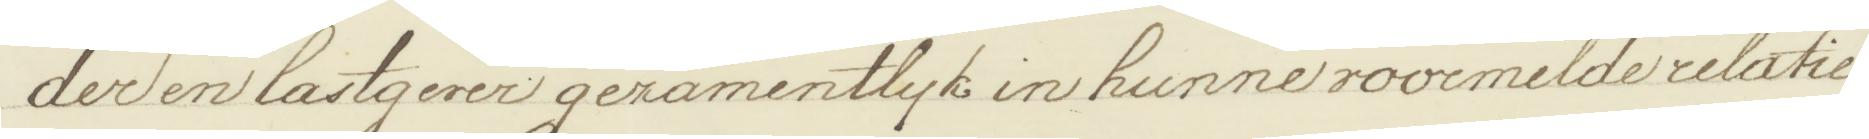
der en lastgever gezamentlyk in hunne voormelde relatie
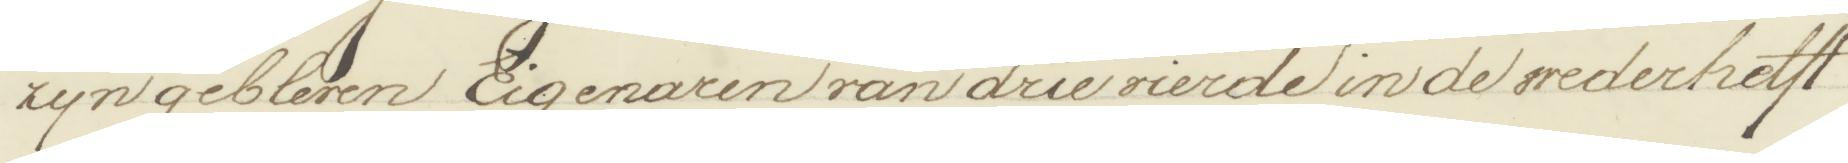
zijn gebleven Eigenaren van drie vierde in de wederhelft
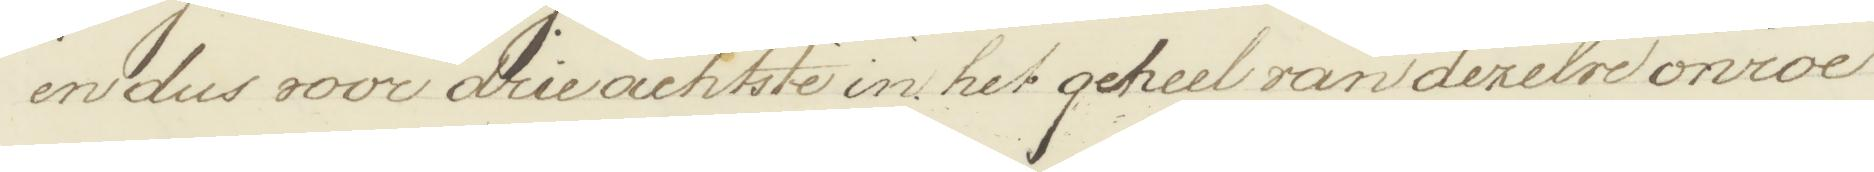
en dus voor drie achtste in het geheel van dezelve onroe
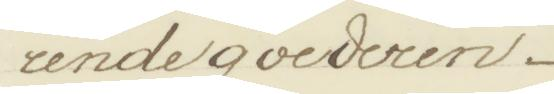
rende goederen.-
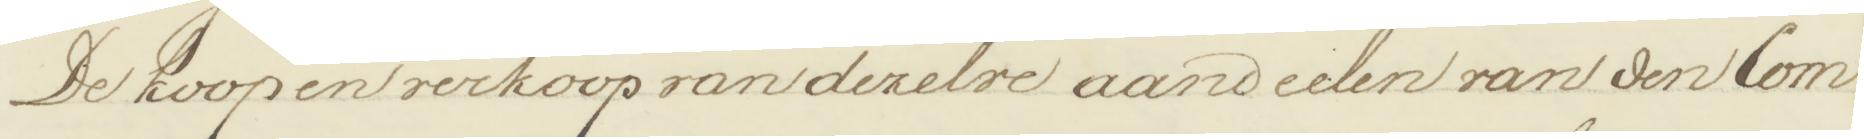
De koop en verkoop van dezelve aandeelen van den Com
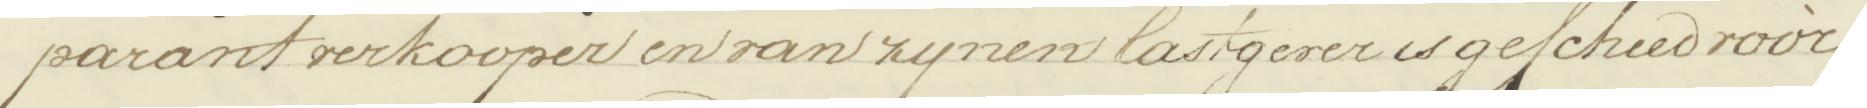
parant verkooper en van zynen lastgever is geschied voor
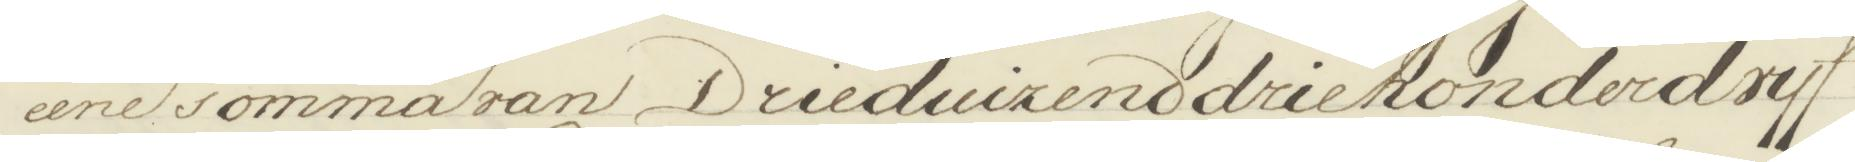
eene somma van Drieduizend, drie honderd vyf
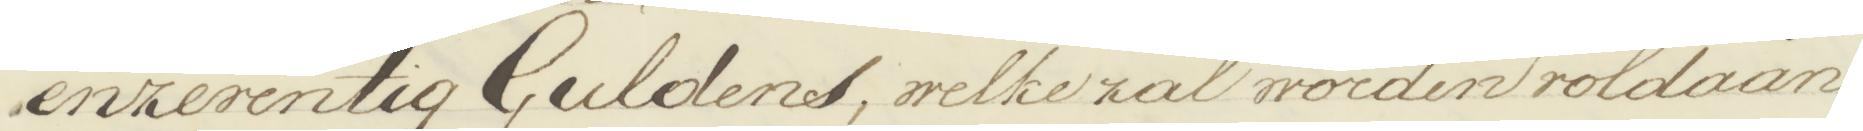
en zeventig Guldens, welke zal worden voldaan
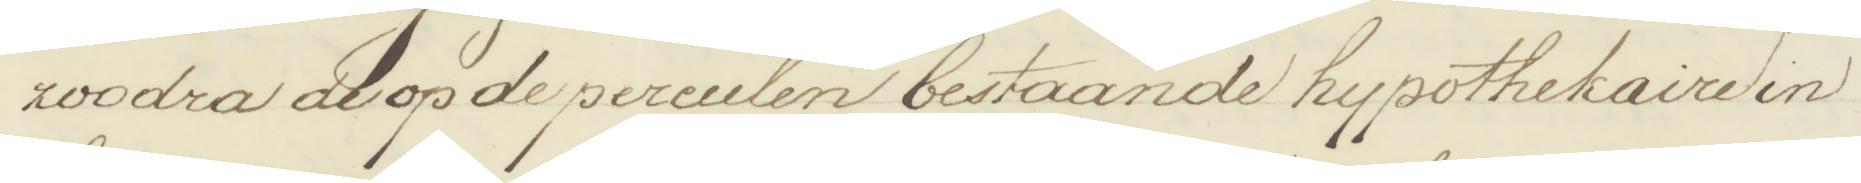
zoodra de op de perceelen bestaande hypothekaire in
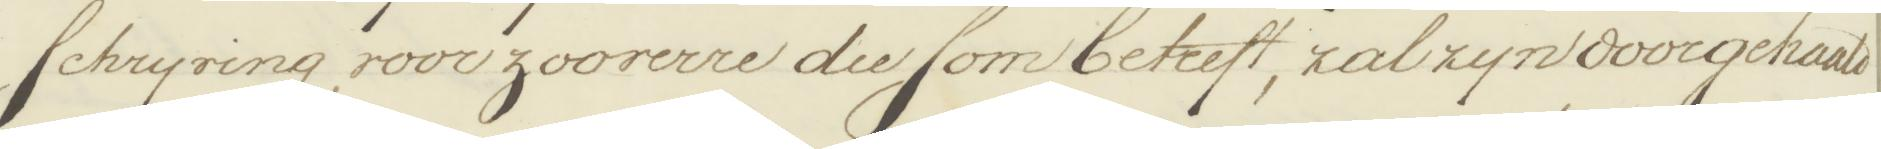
schryving voor zooverre die som betreft, zal zyn doorgehaald
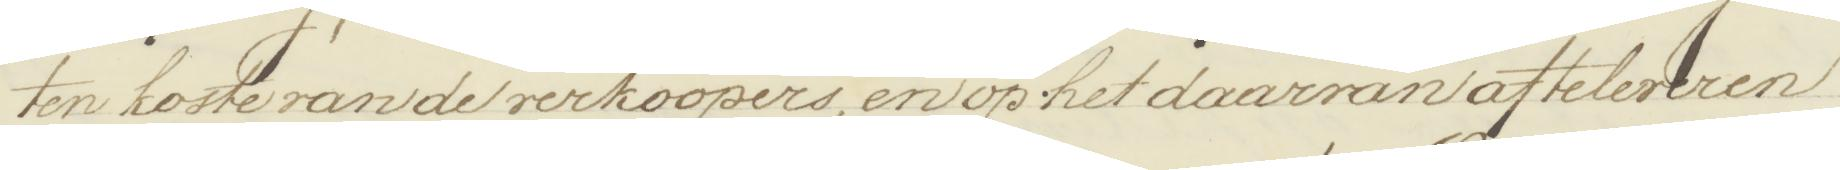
ten koste van de verkoopers, en op het daarvan af televeren
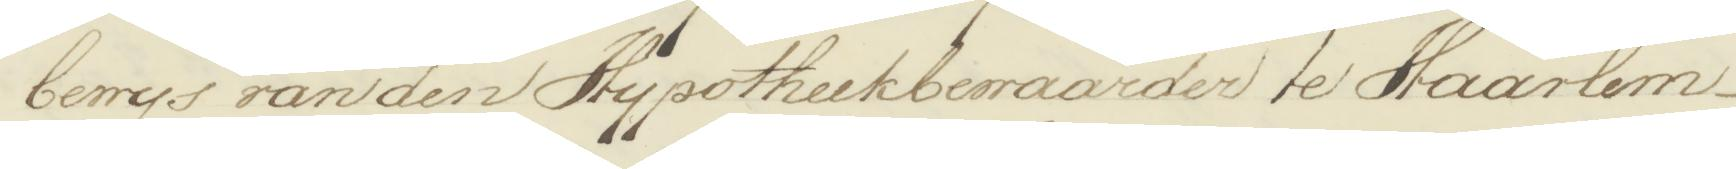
bewys van den Hypotheekbewaarder te Haarlem-
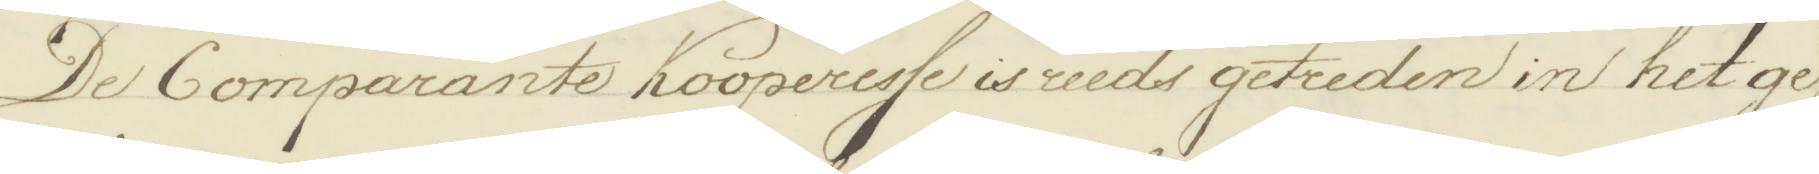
De Comparante Kooperesse is reeds getreden in het ge
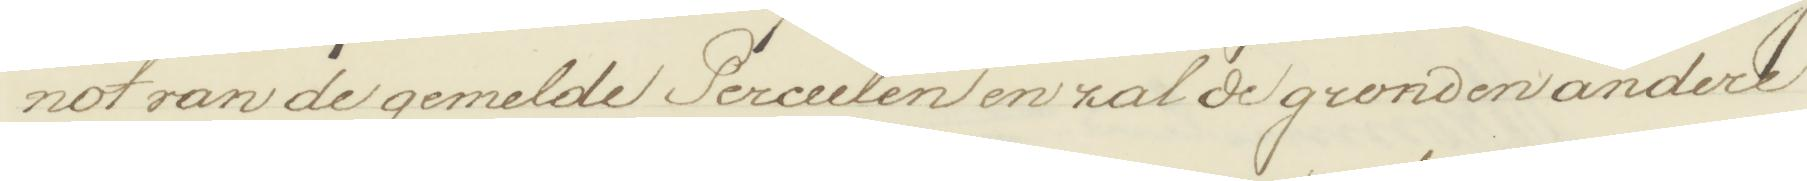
not van de gemelde Perceelen en zal de gronden andere
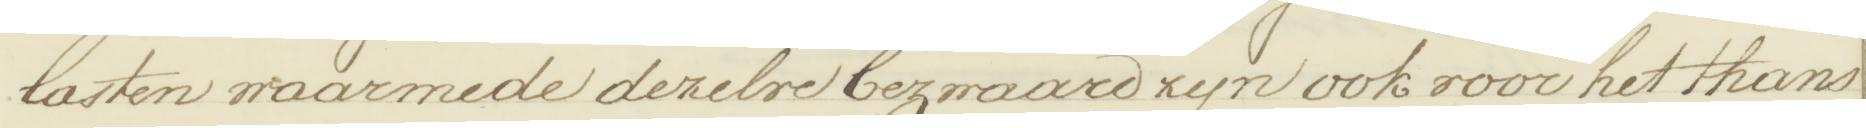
lasten waarmede dezelve bezwaard zijn ook voor het thans
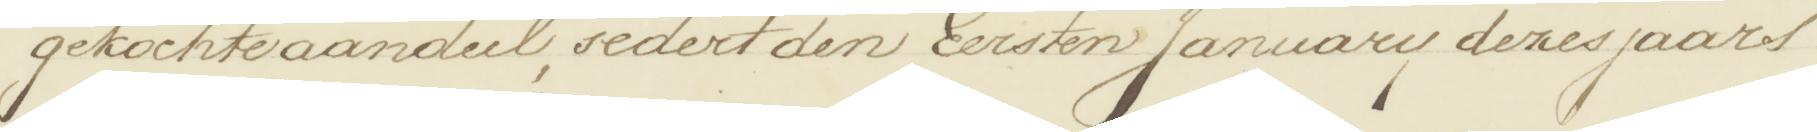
gekochte aandeel, sedert den Eersten January dezes jaars
